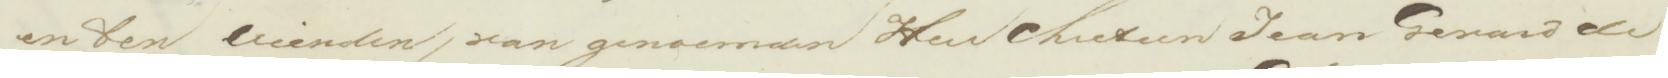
en ten vierden, van genoemden Heer Chretien Iean Gerard de
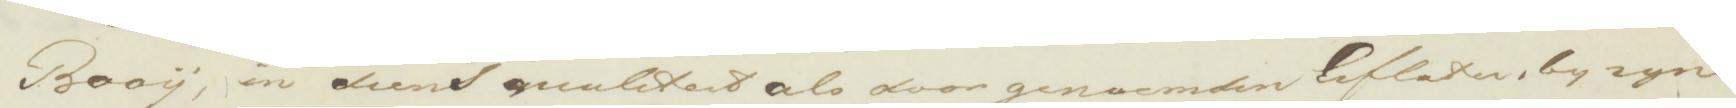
Booij, in diens qualiteit als door genoemden Erflater, by zyn
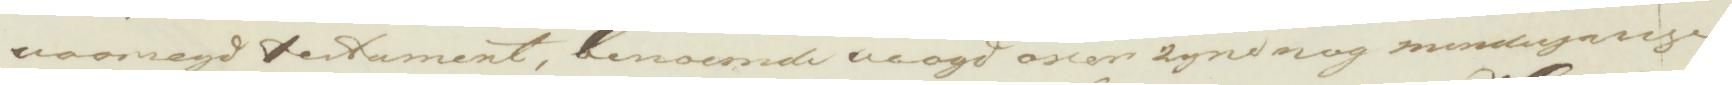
voorzegd testament, benoemde voogd over zyne nog minderjarige
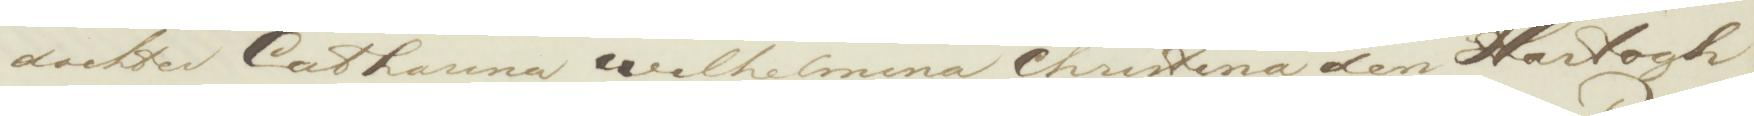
dochter Catharina wilhelmina christina den Hartogh
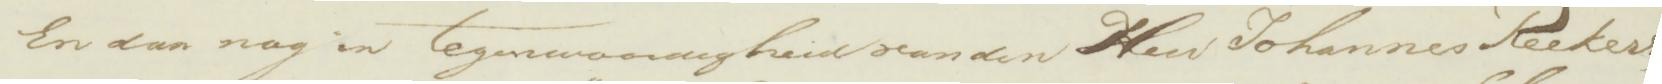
En dan nog in tegenwoordigheid van den Heer Iohannes Reekers
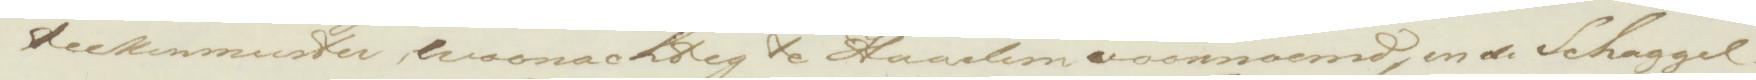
teekenmeester, woonachtig te Haarlem voornoemd, in de Schaggel
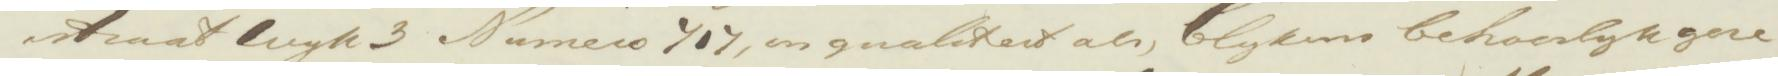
straat wyk 3 Numero 717, in qualiteit als blykens behoorlyk gere
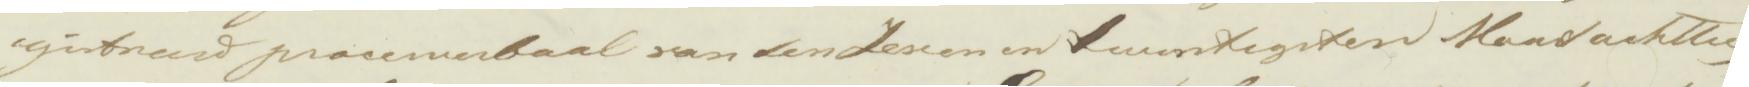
„gistreerd procesverbaal van den zeven en twintigsten Maart achttien
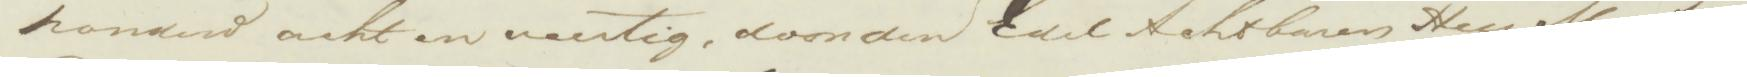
honderd acht en veertig, door den Edel Achtbaren Heer Meester
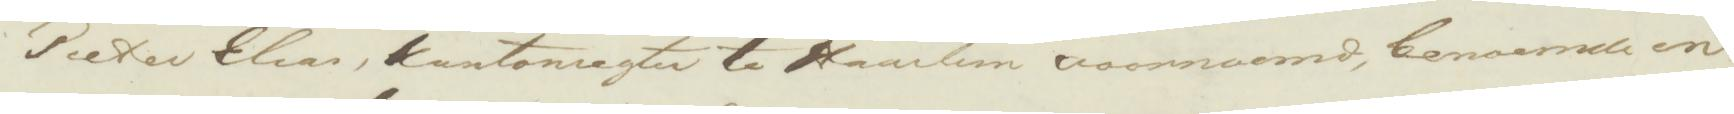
Pieter Elias, kantonregter te Haarlem voornoemd, benoemde en
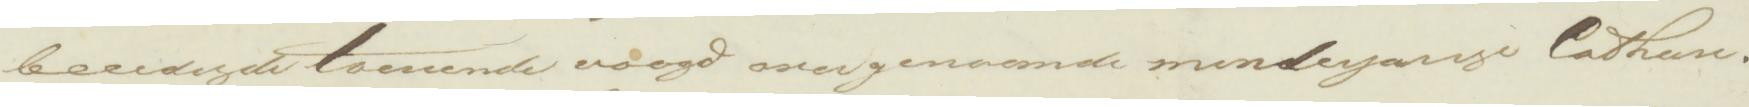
beeedigde toeziende voogd over genoemde minderjarige Cathari,
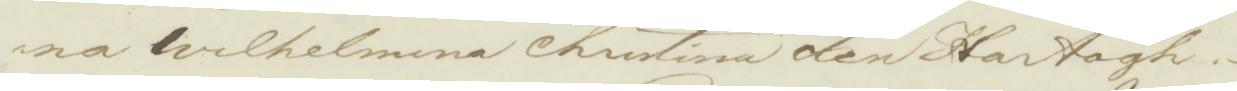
na Wilhelmina Christina den Hartogh.
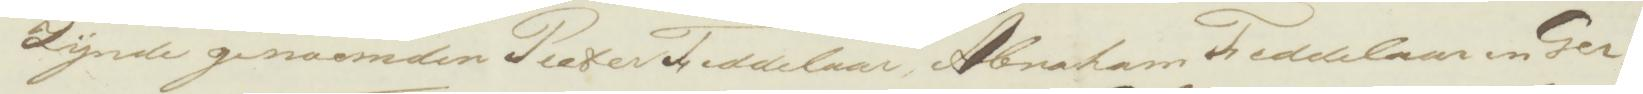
Zijnde genoemden Pieter Fiddelaar, Abraham Fiddelaar en Ger
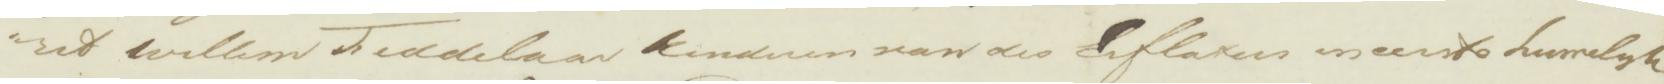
rit willem Fiddelaar kinderen van des Erflaters in eerste huwelyk
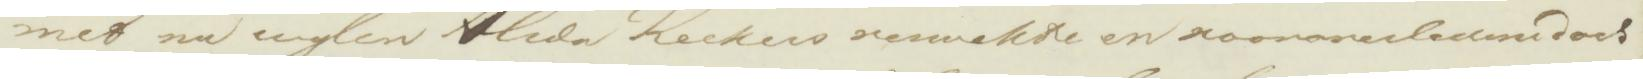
met nu wylen Alida Reekers verwekte en vooroverleden doch
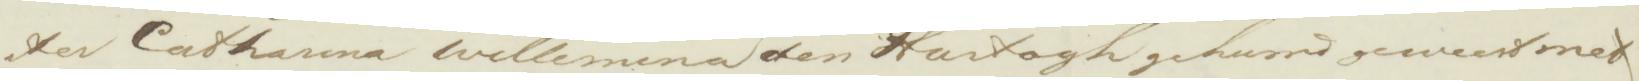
ter Catharina willemina den Hartogh gehuwd geweest met
